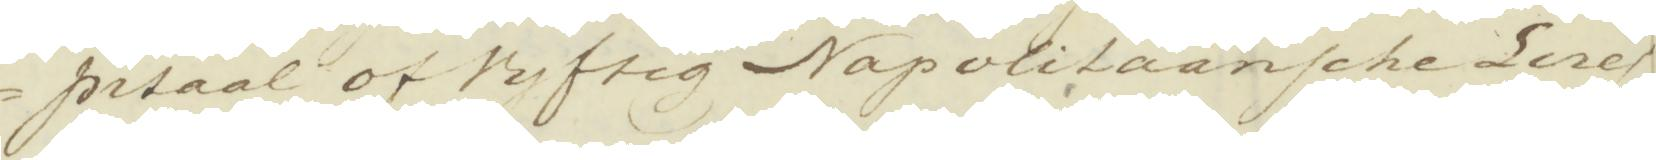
= pitaal of Vijftig Napolitaansche Lires
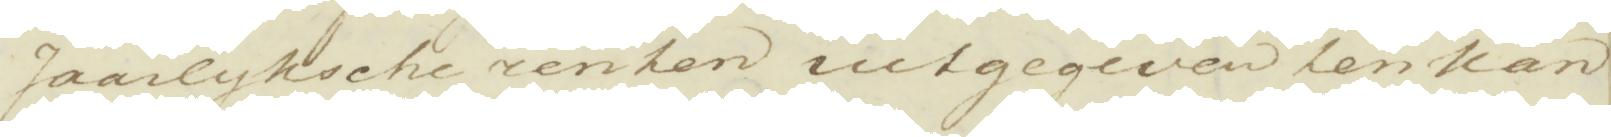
Jaarlyksche renten uitgegeven ten kan
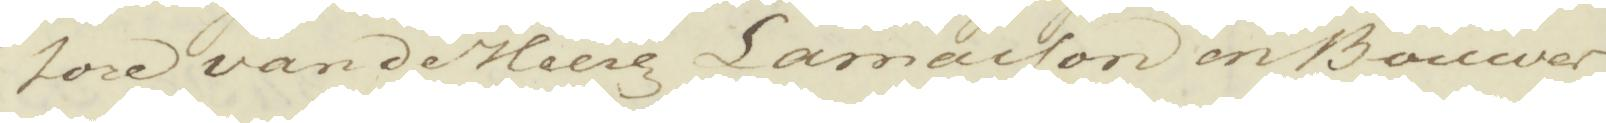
tore van de Heeren Lamaison en Bouwer
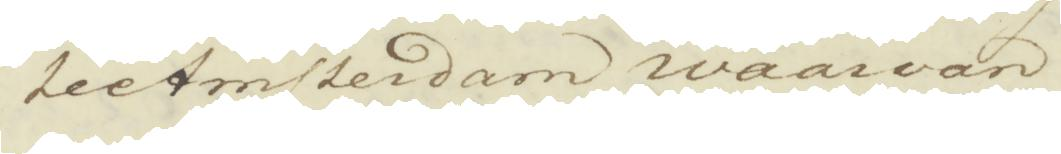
teAmsterdam waarvan
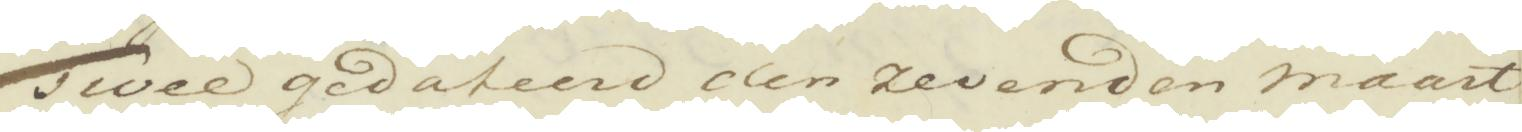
Twee gedateerd den zevenden maart
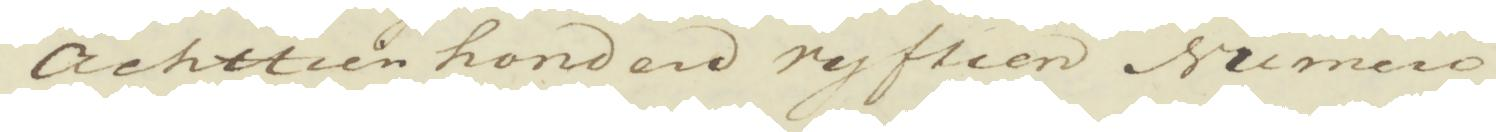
Achttien honderd vjftien Numero
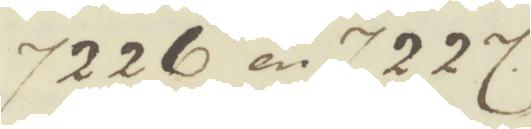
7226 en 7227.
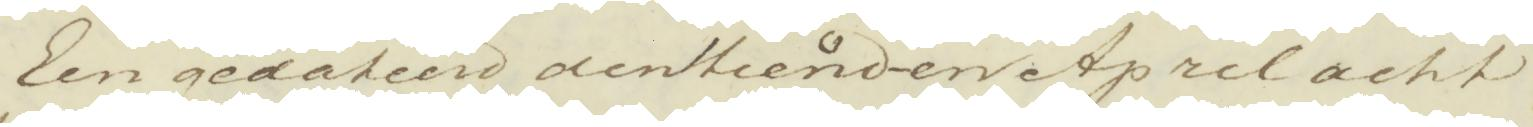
Een gedateerd den tienden April acht
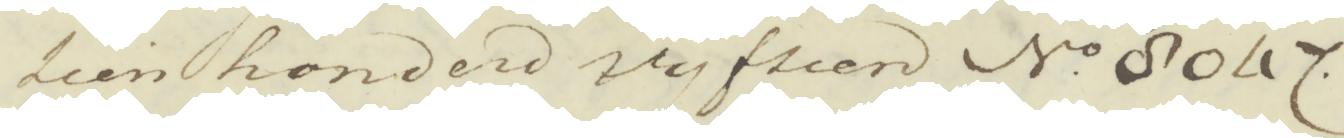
tien honderd vyftien N.o 8047.
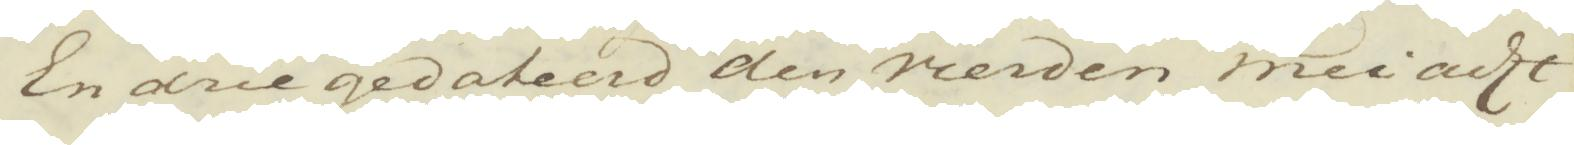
En drie gedateerd den vierden mei acht
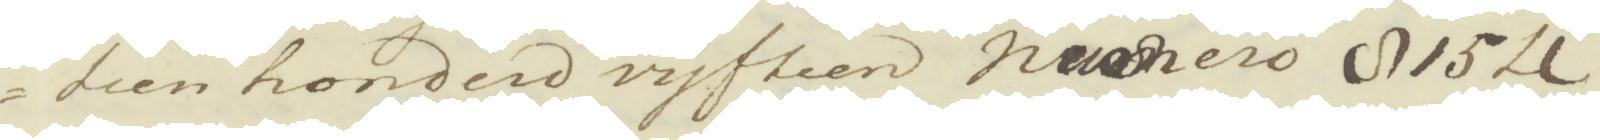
= tien honderd vyftien Numero 8154
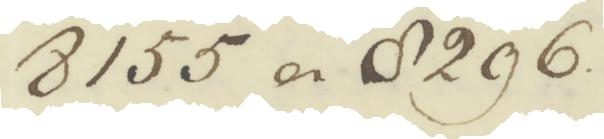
8155 en 8296.
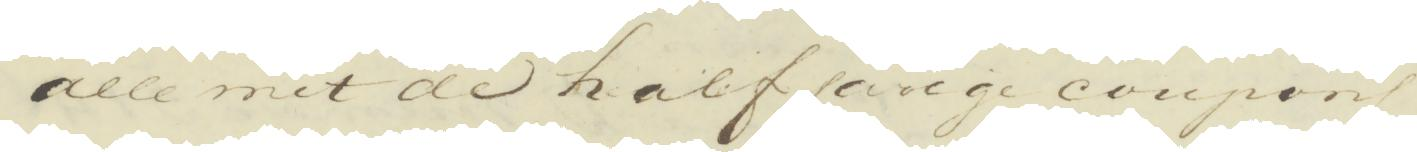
alle met de half jarige coupons
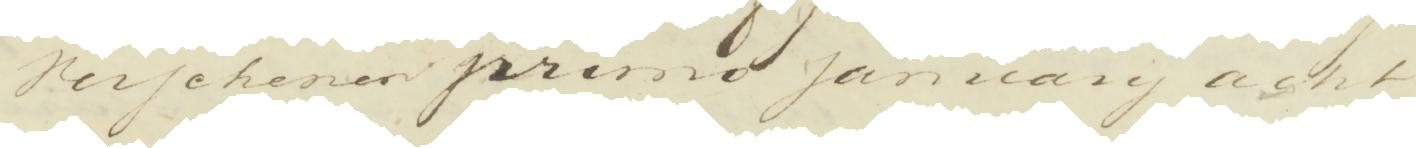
Verschenen primo Januarij acht
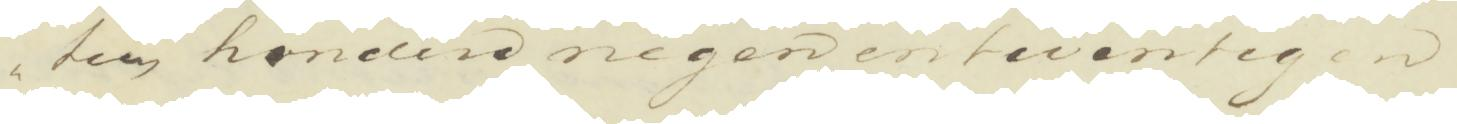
„ tien honderd negen en twintig en
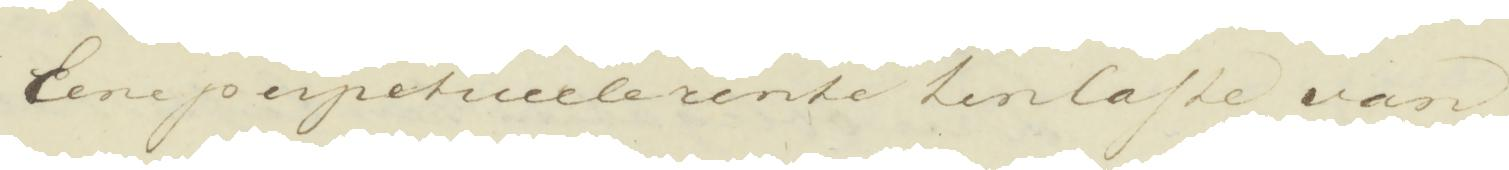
Eene perpetueele rente tenlaste van
